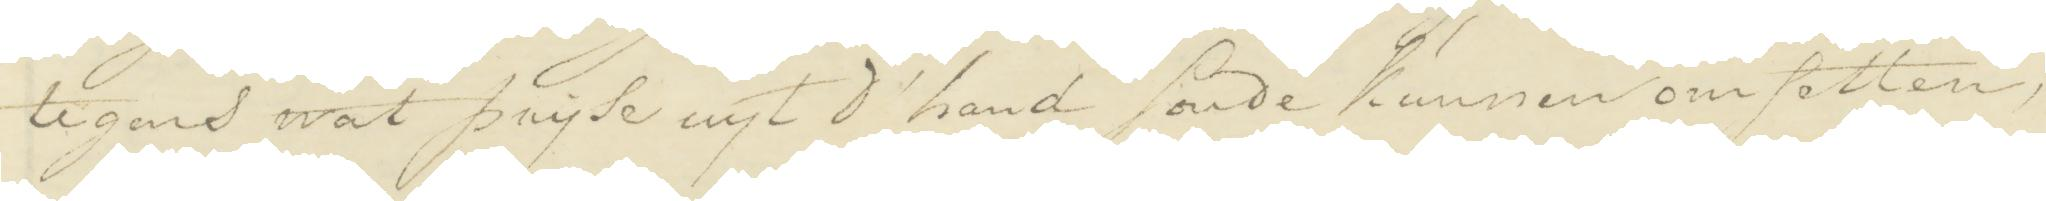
tegens wat prijse uyt d’ hand soude kunnen om setten,
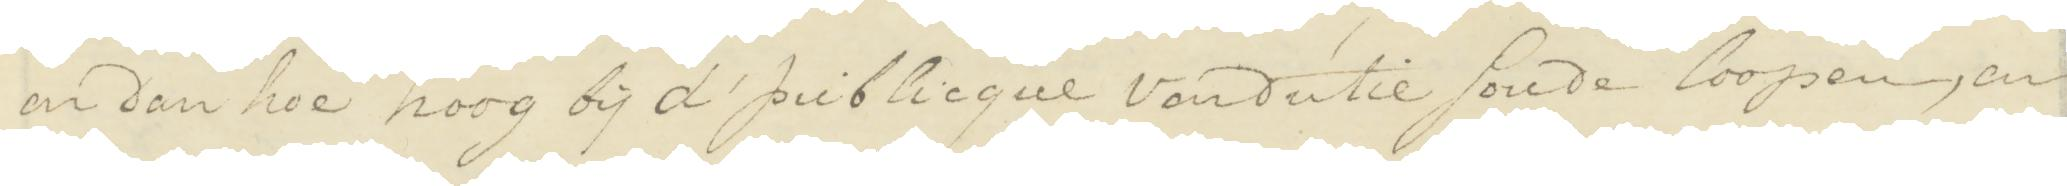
en dan hoe hoog bij d' publicque vendutie soude loopen, en
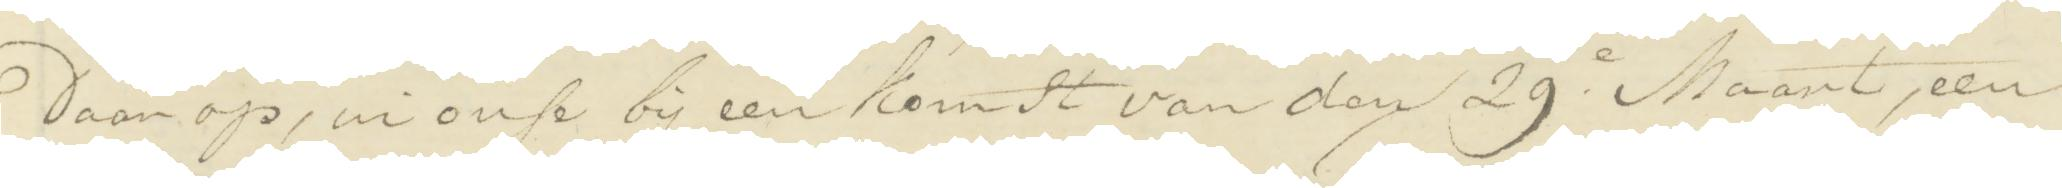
daar op, in onse bij een komst van den 29.e Maart, een
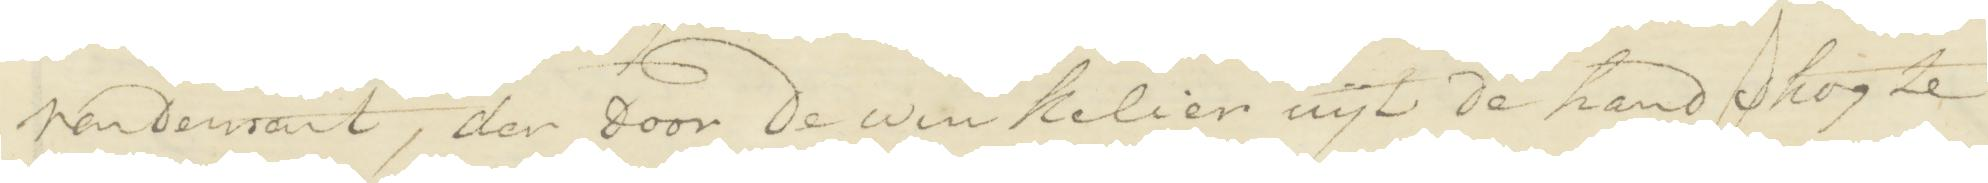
rendement, der door de winkelier uijt de hand verkogte
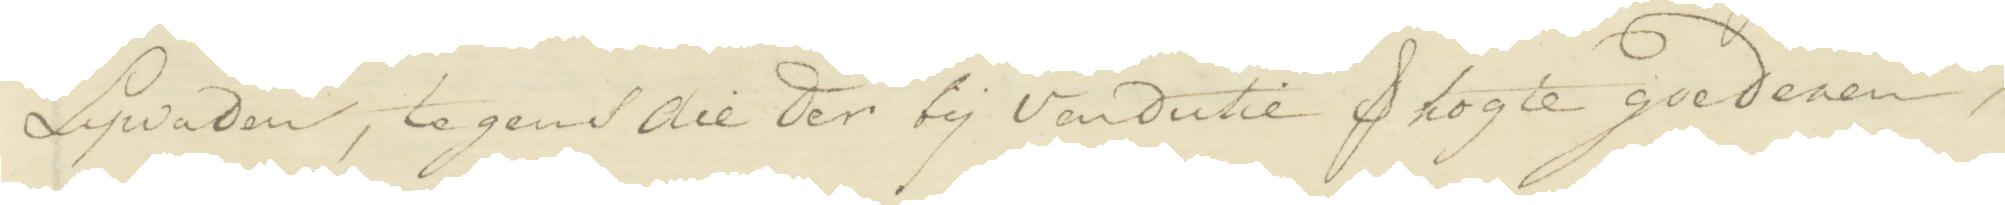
Lywaden, tegens die der bij vendutie verkogte goederen,
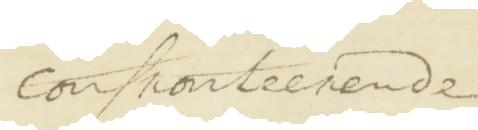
confronteerende
